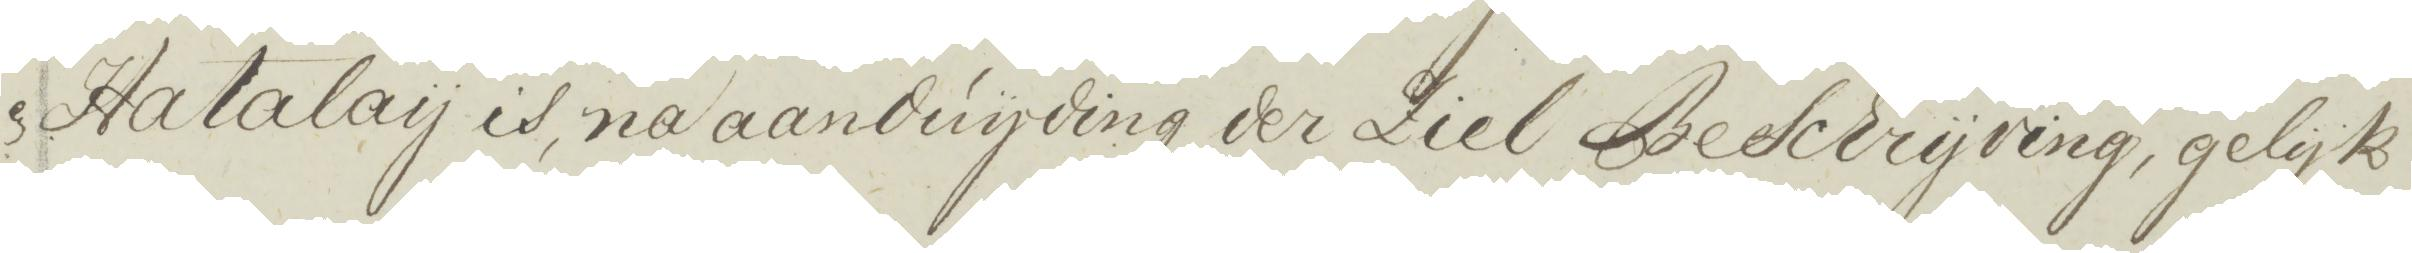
en Hatalaij is, na aanduijding der Ziel Beschrijving, gelijk
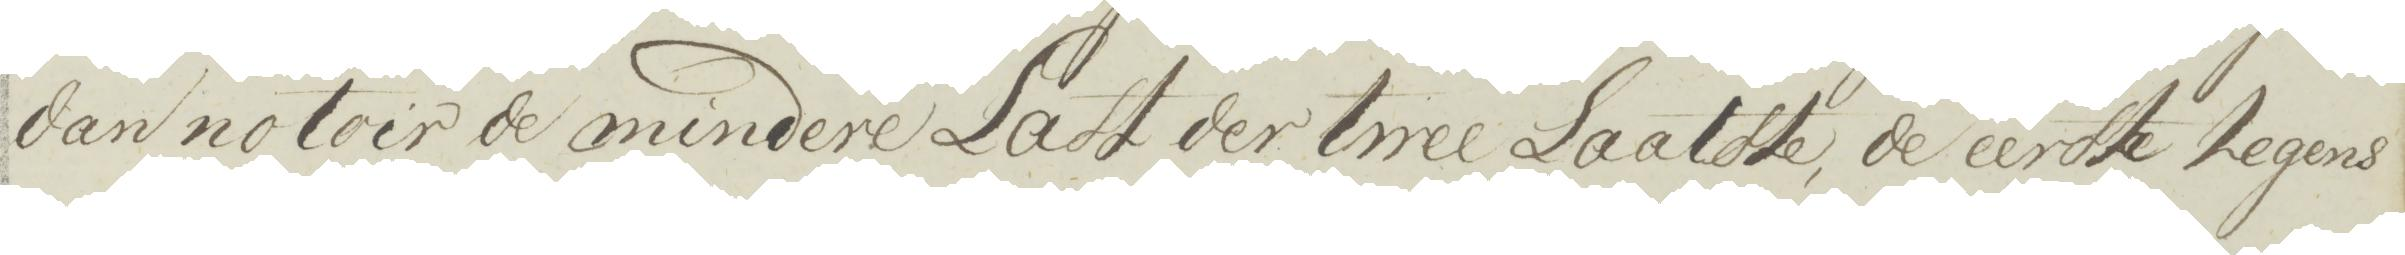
dan notoir de mindere Last der twee Laatste, de eerste tegens
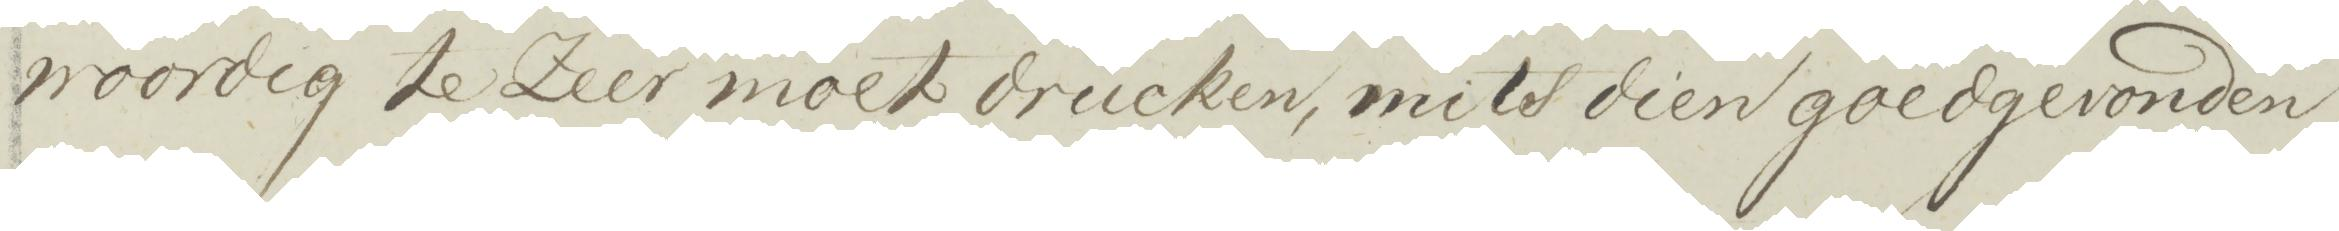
woordig te zeer moet drucken, mits dien goedgevonden
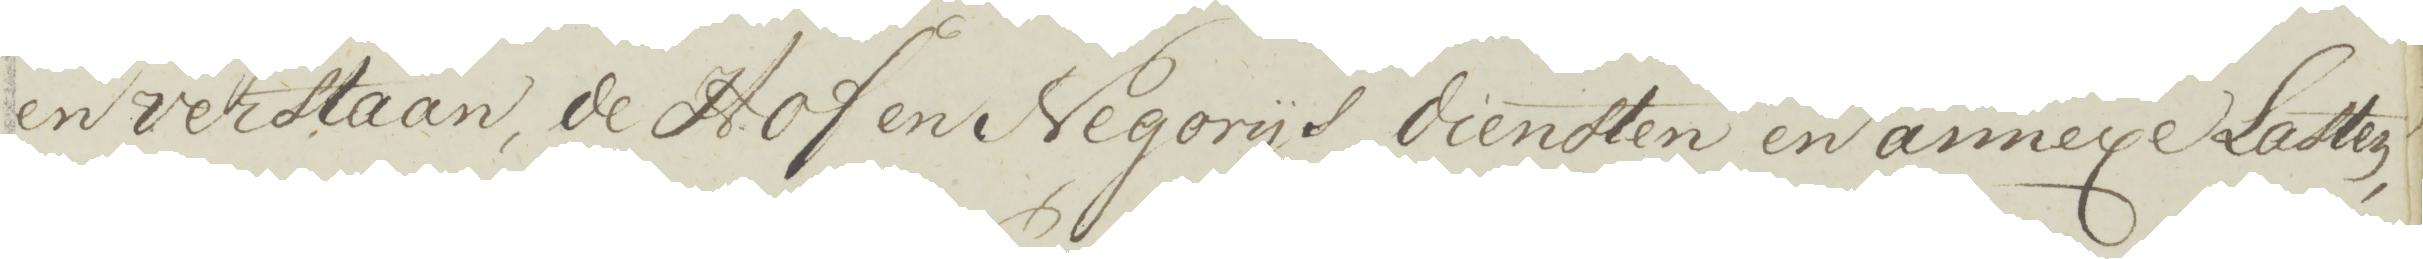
en verstaan, de Hof en Negorijs diensten en annexe Lasten,
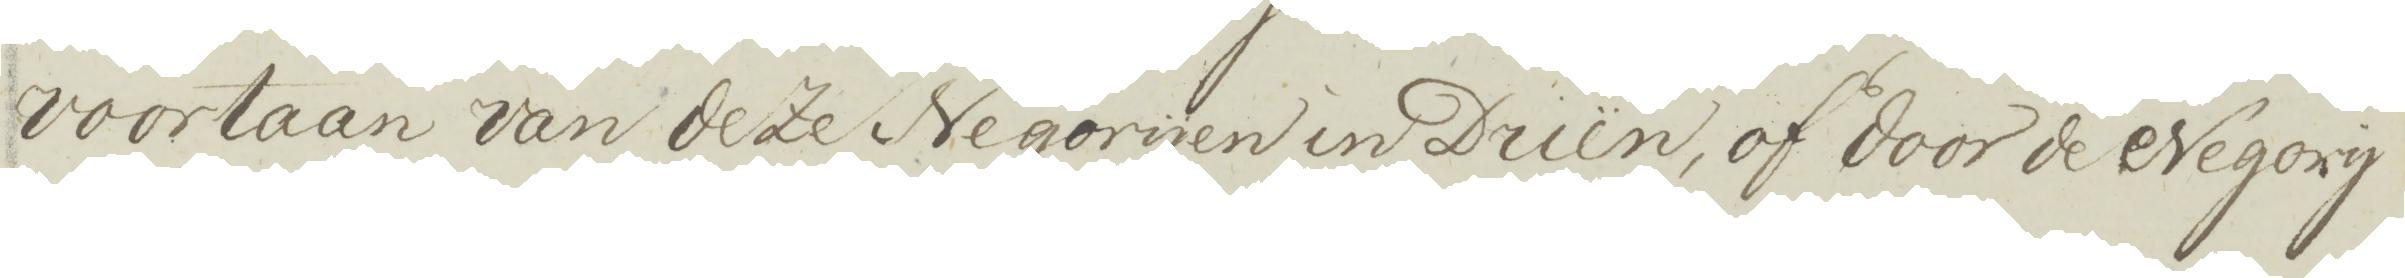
voortaan van deze Negorijen in Driën, of door de Negorij
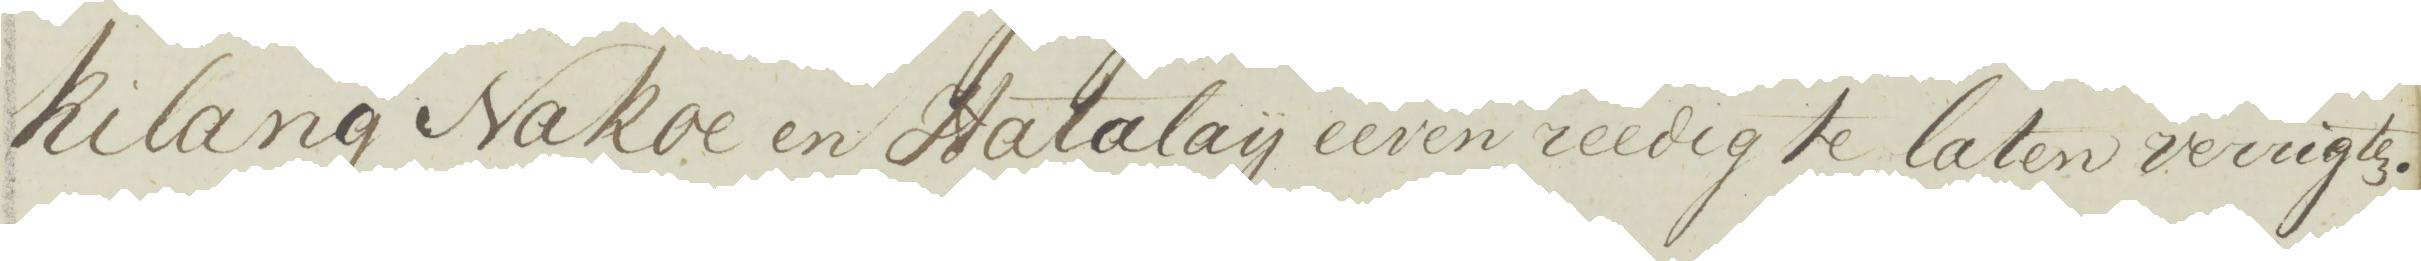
Kilang Nakoe en Hatalaij eeven reedig te laten verrigten.
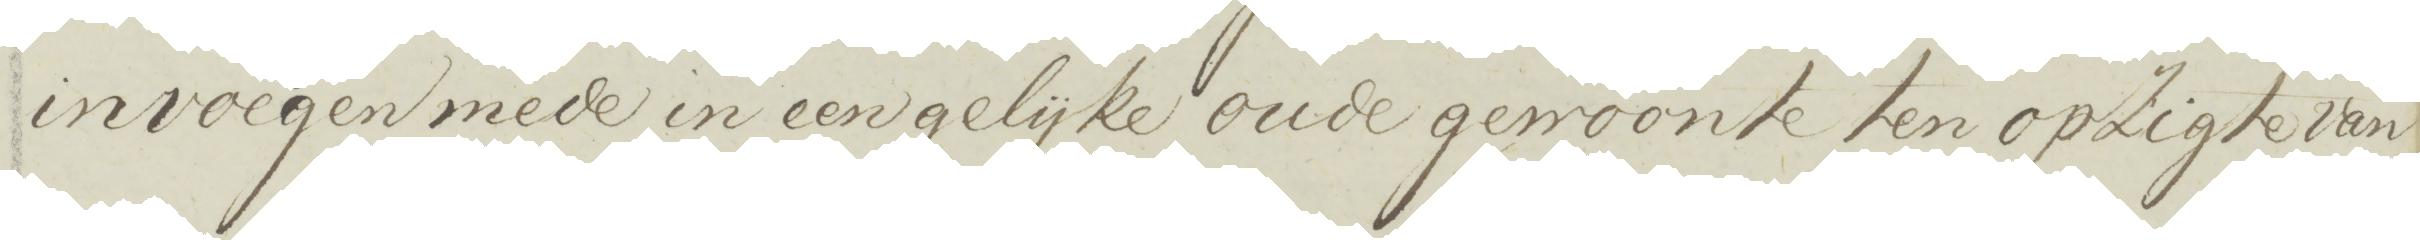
invoegen mede in een gelijke oude gewoonte ten opzigte van
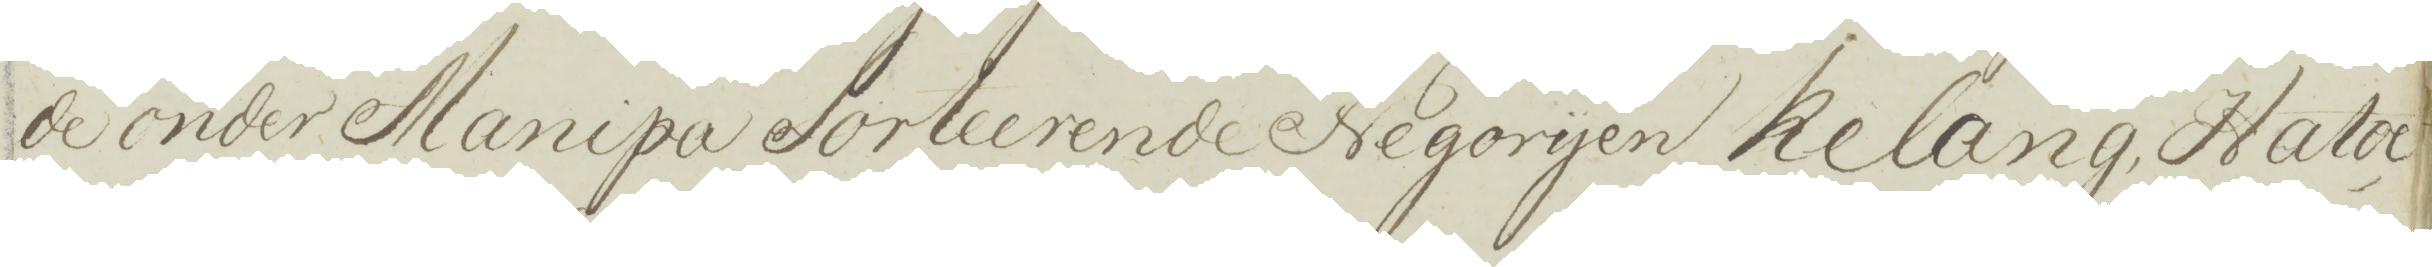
de onder Manipa Sorteerende Negorijen Kelang, Hatoe,
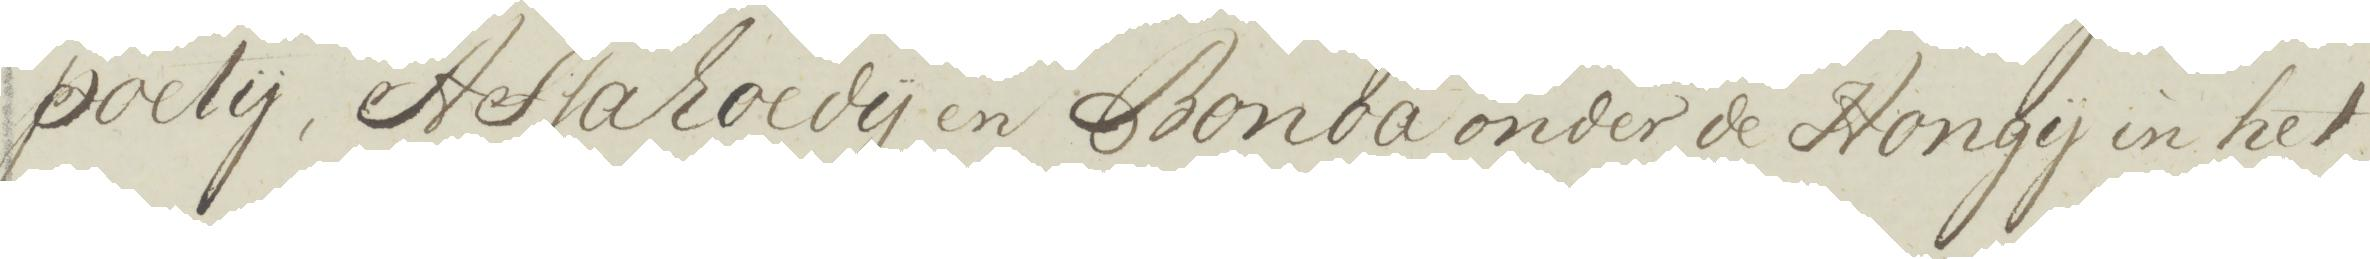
poetij, Assahoedij en Bonoa onder de Hongij in het
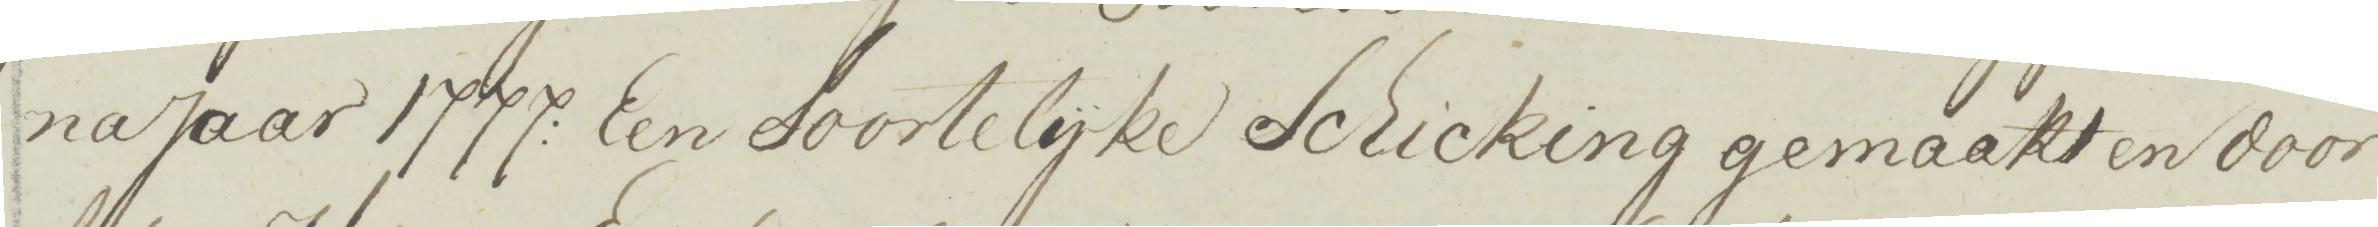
naJaar 1777: Een soortelijke schicking gemaakt en door
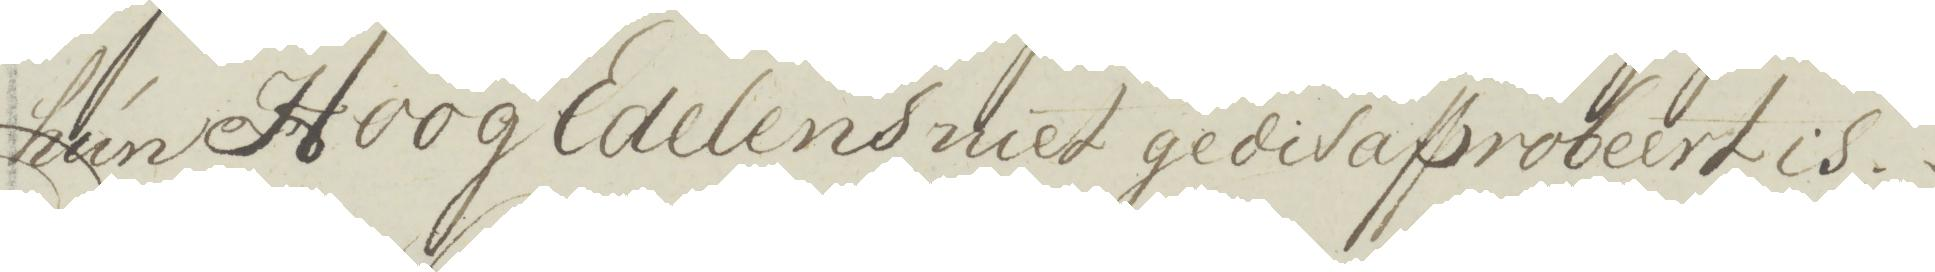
hun Hoog Edelens niet gedisapprobeert is.
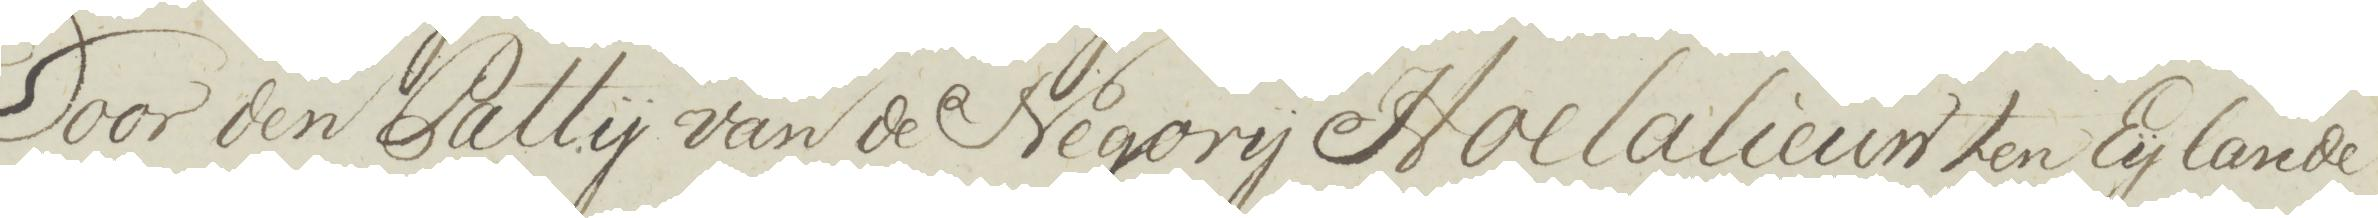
Door den Pattij van de Negorij Hoelalieuw ten Eijlande
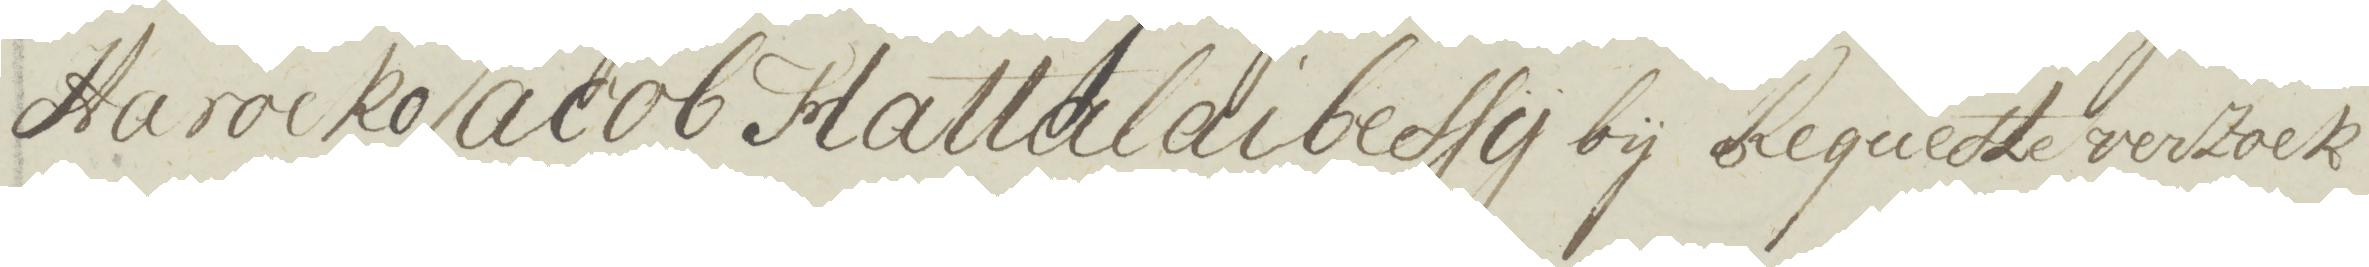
Haroeko Jacob Hattalaibessij bij Requeste verzoek
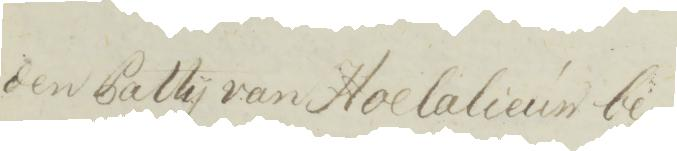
den Pattij van Hoelalieuw be„
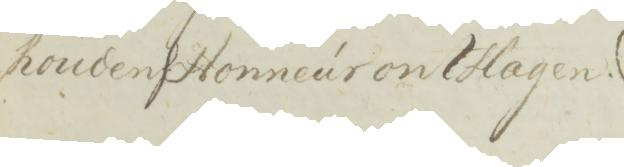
houdens Honneur ontslagen.
